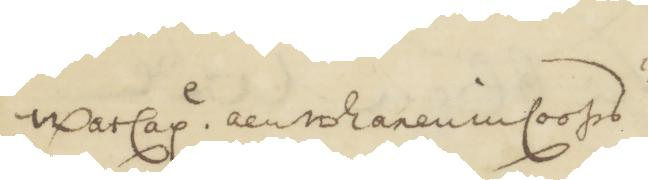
wat cap.e aen scharen in Coops
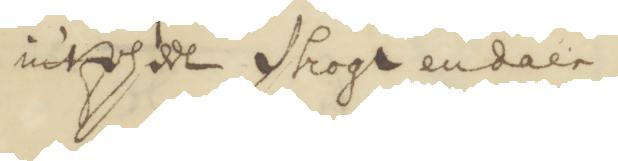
in ’t gheel verkogt en daer
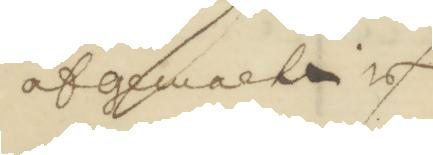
afgemaekt is
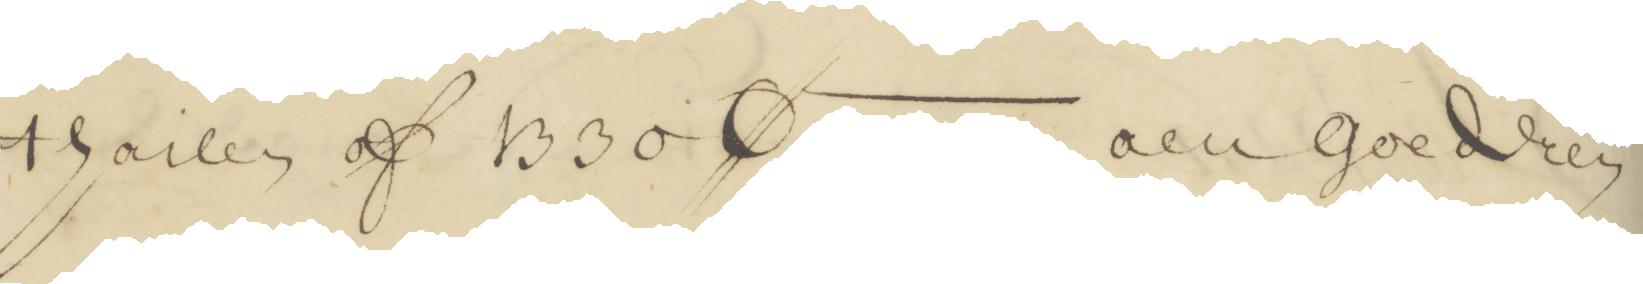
thailen of 1330ø gls: aen goederen
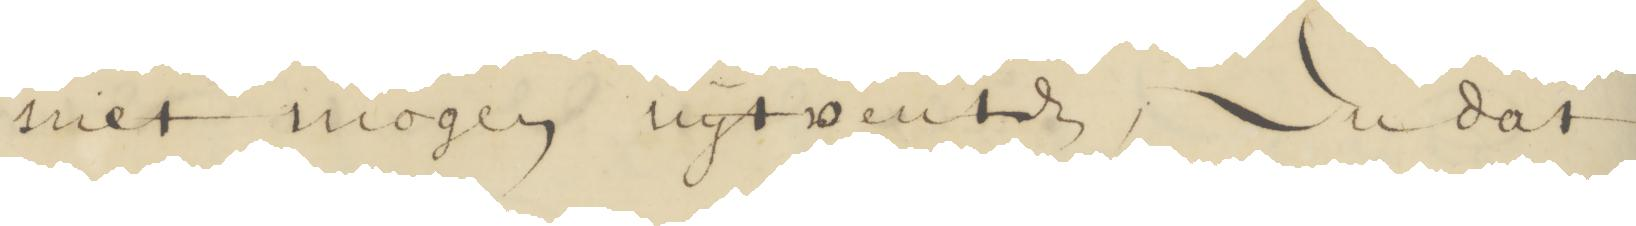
niet mogen uijtventen, En dat
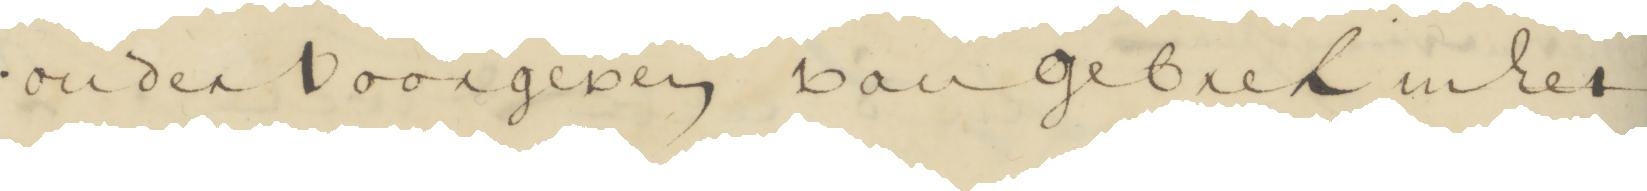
onder voorgeven van gebrek in het
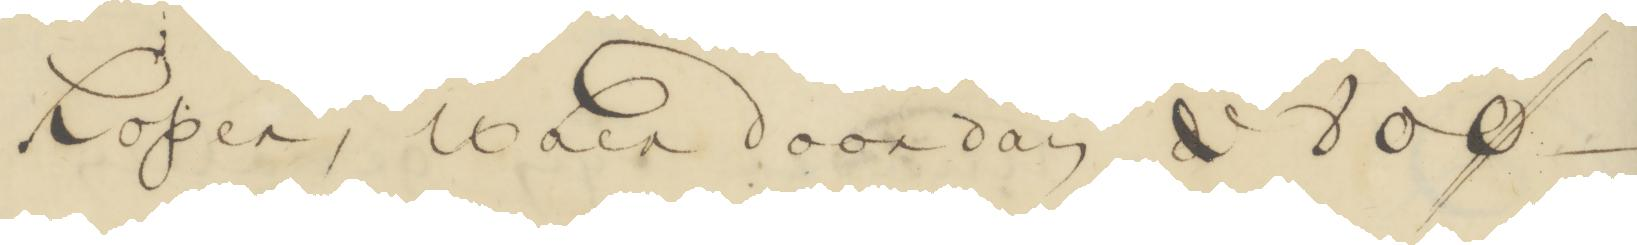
koper, waer door dan de 80ø.
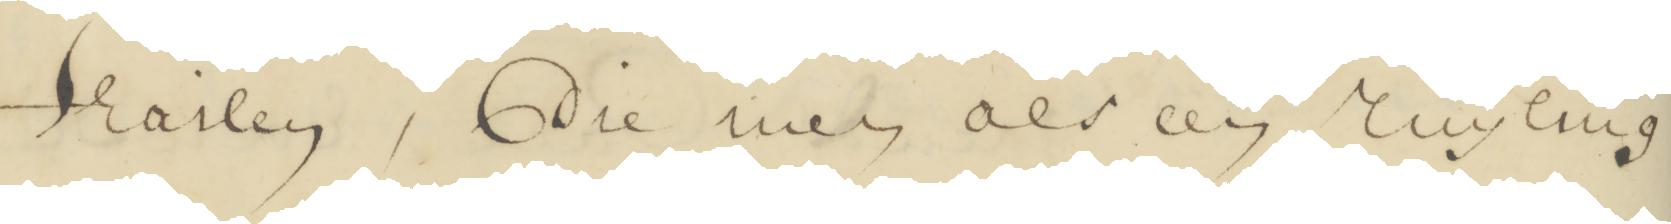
thailen, die men als een ruijling
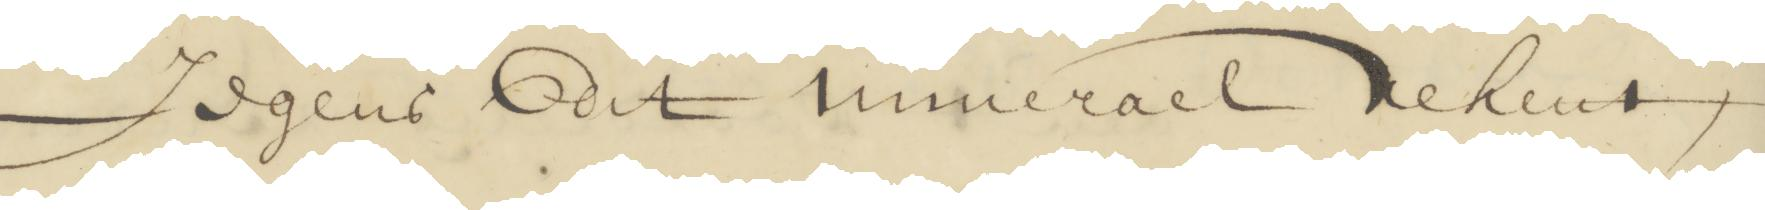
Jegens dit minerael rekent,
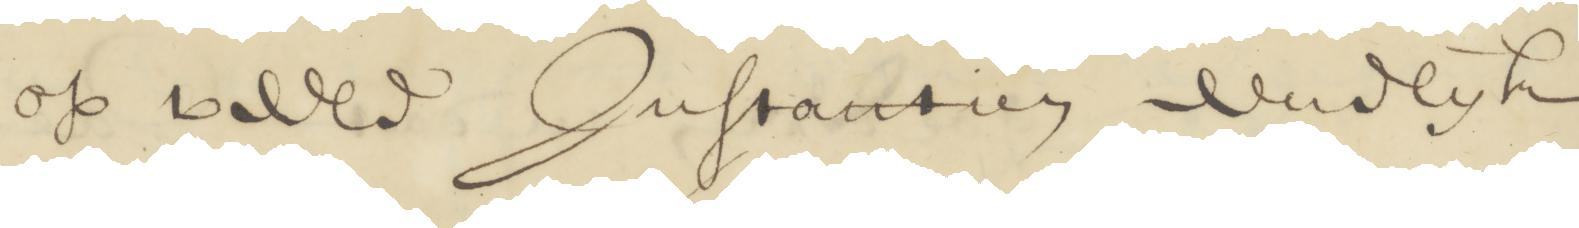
op veele Jnstantien eenelijk
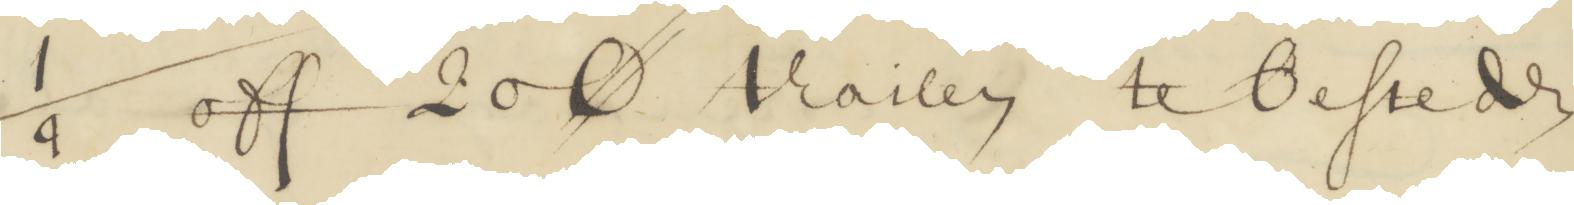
¼ off 20ø thailen te besteden
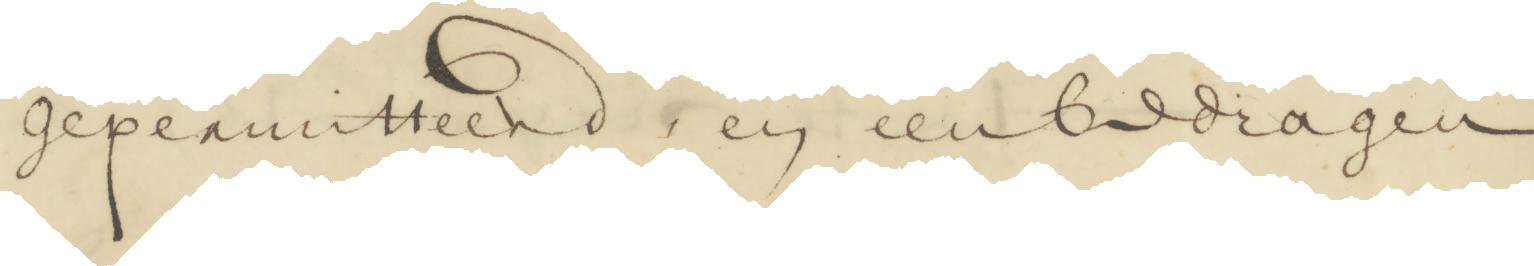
gepermitteerd, en een bedragen
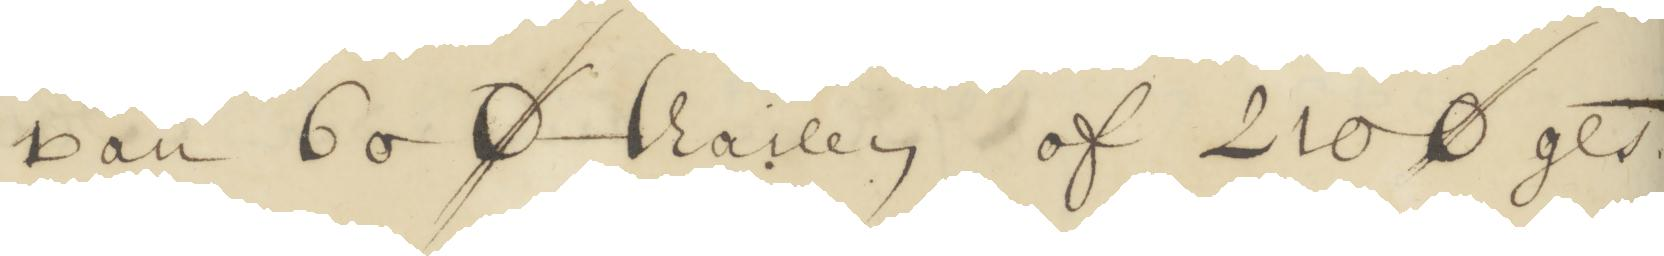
van 60ø thailen of 210ø gls.
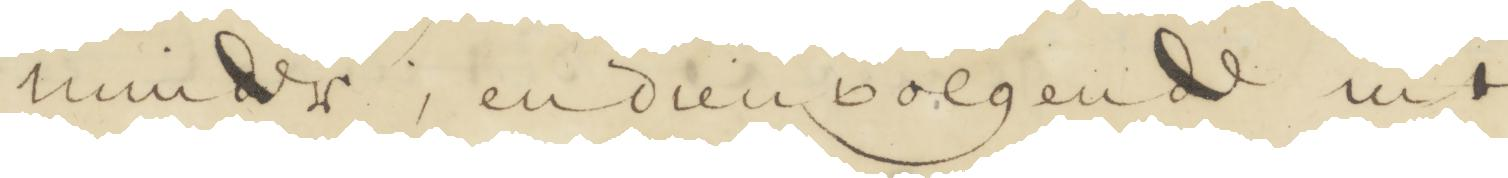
minder; en dien volgende in’t
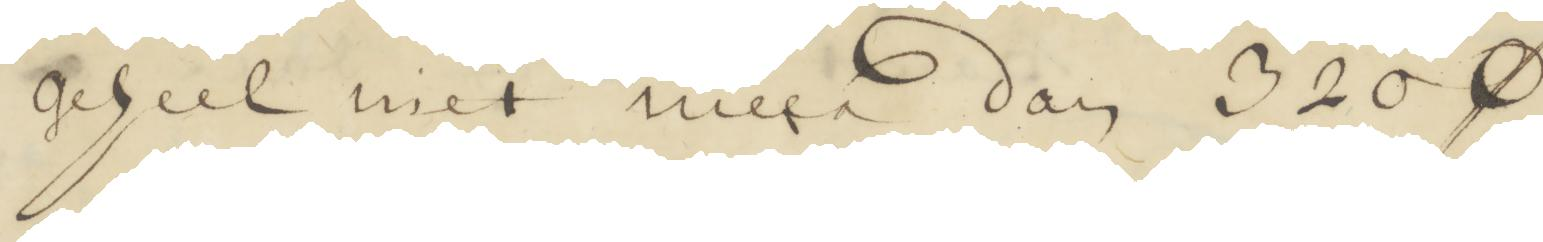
geheel niet meer dan 320ø
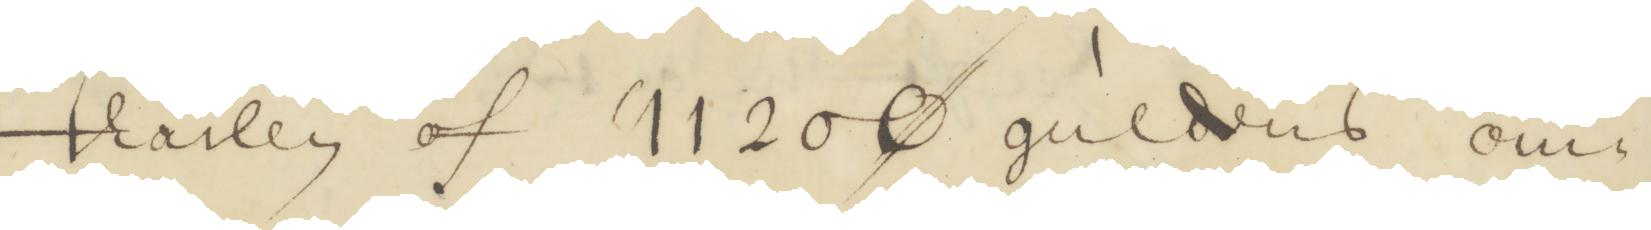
thailen of 1120ø guldens om„
